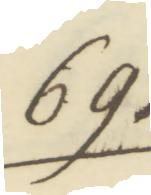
691
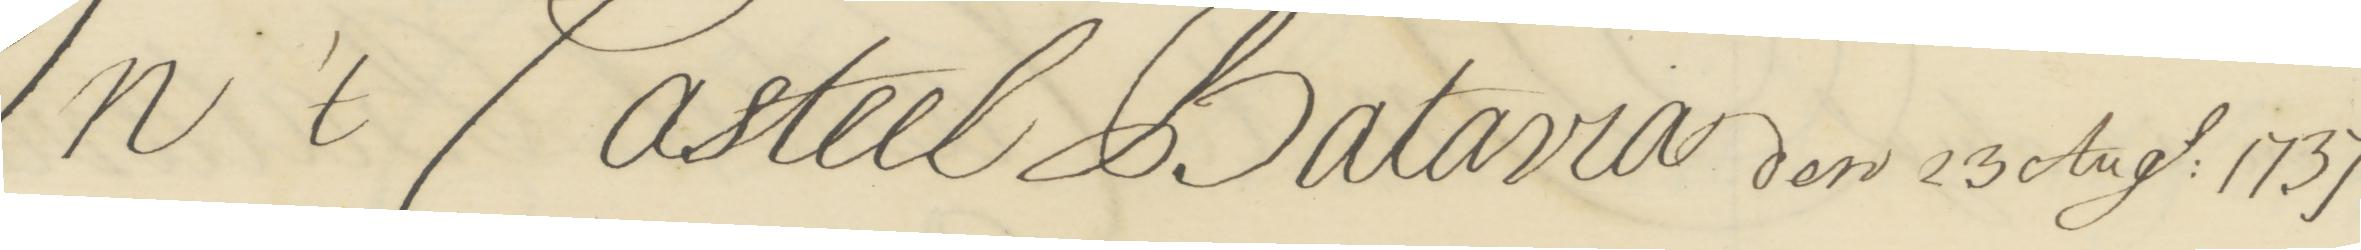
n 't Casteel Batavia den 23 Aug:s 1737
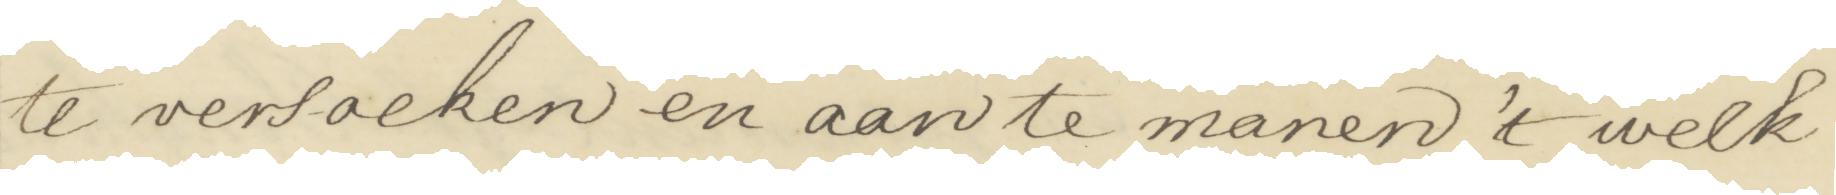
te versoeken en aan te manen ’t welk
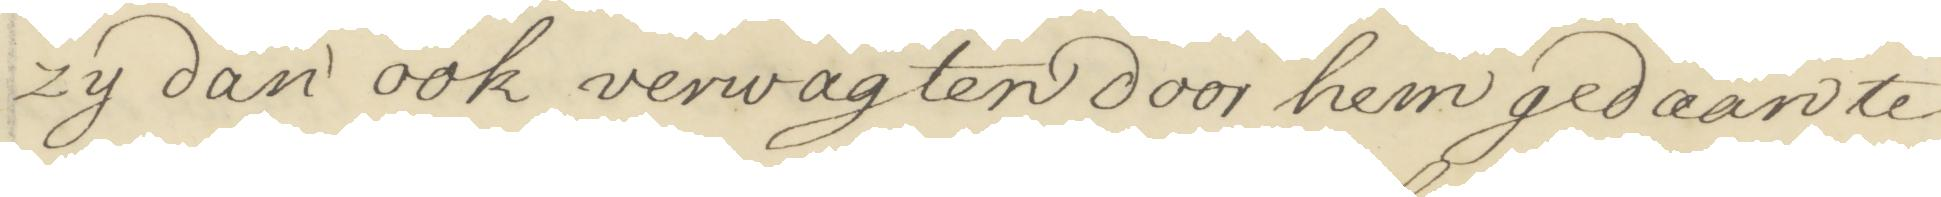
zy dan ook verwagten door hem gedaan te
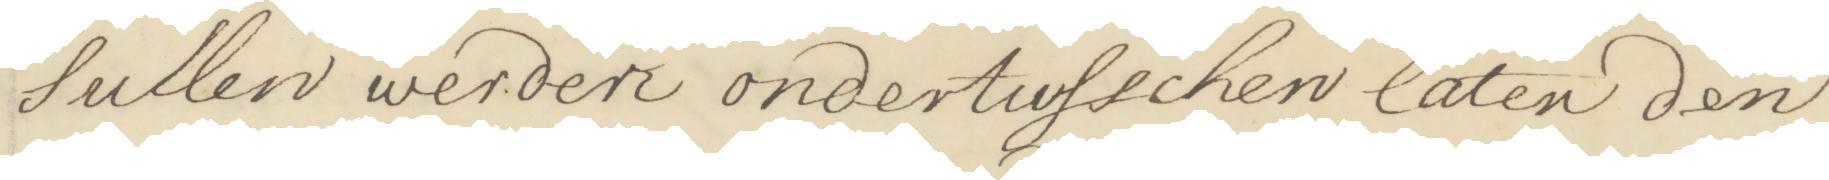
sullen werden ondertusschen laten den
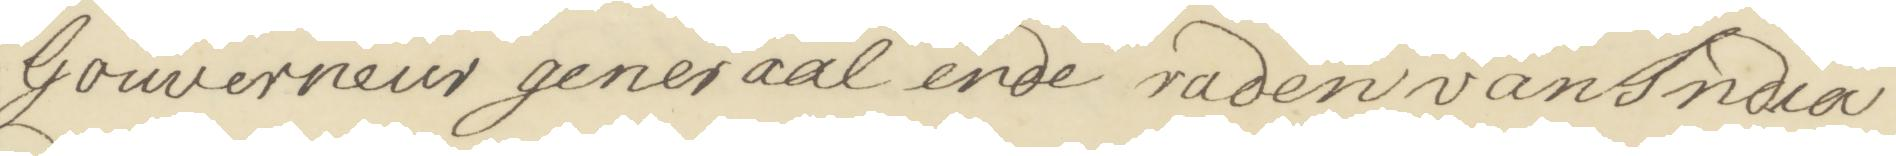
Gouverneur generaal ende raden van India
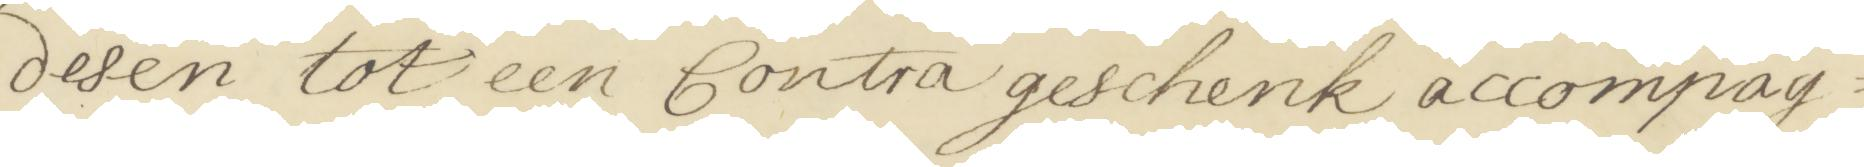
desen tot een contra geschenk accompag
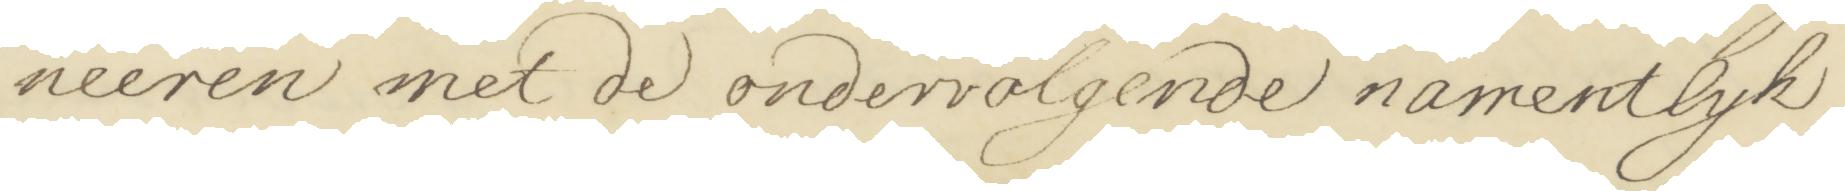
neeren met de ondervolgende namentlyk
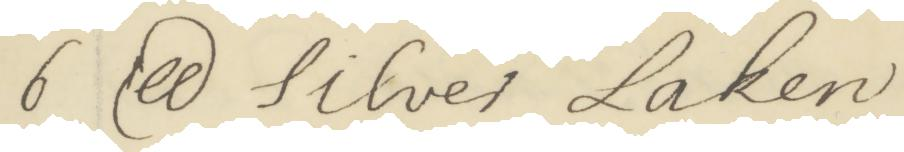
6 @ silver Laken
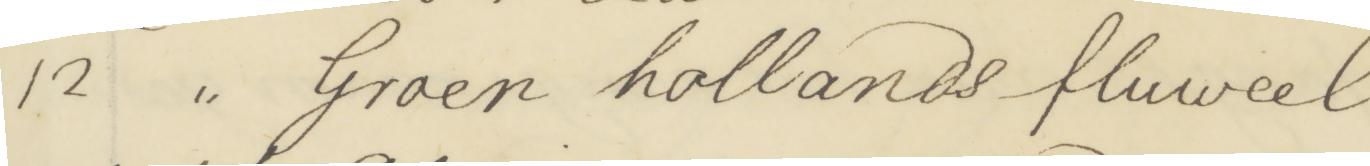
12 „ Groen hollands fluweel
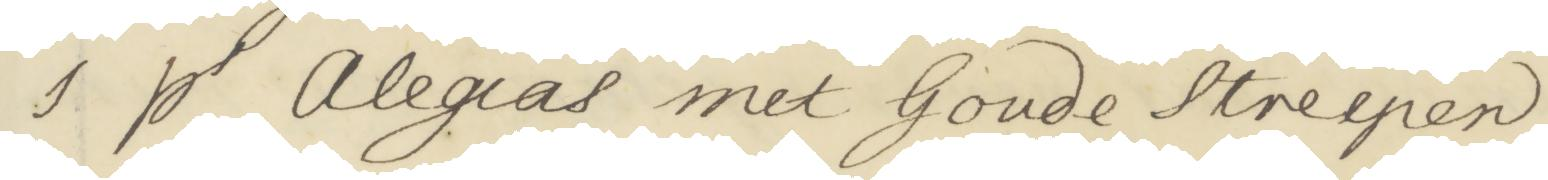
1 p:s Alegias met Goude streepen
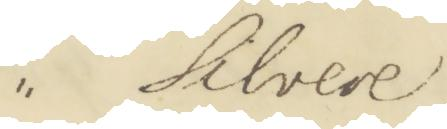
„ silvere
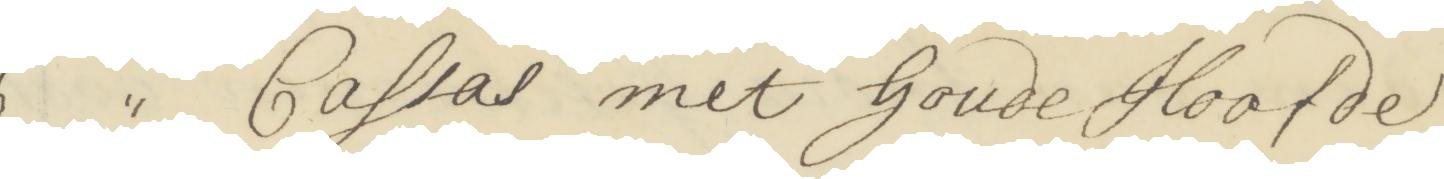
„ Cassas met goude Hoofde
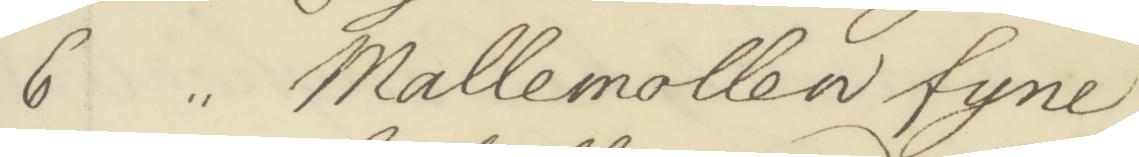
6 „ Mallemollen fyne
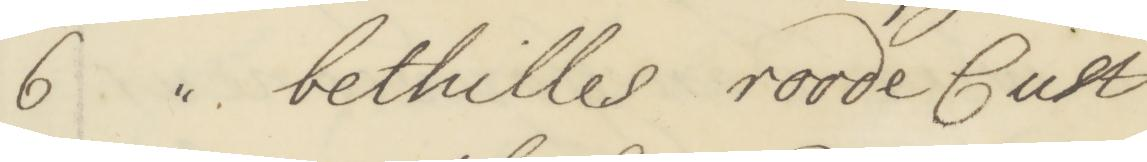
6 „ bethilles roode Cust
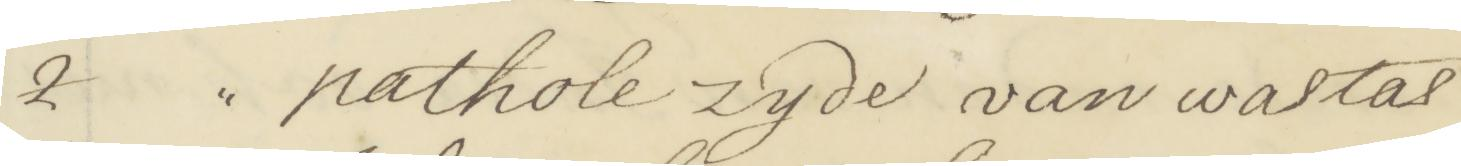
2 „ pathole zyde van wastas
